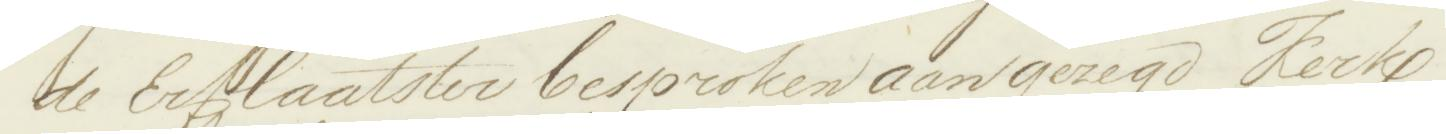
de Erflaatster besproken aan gezegd Kerk
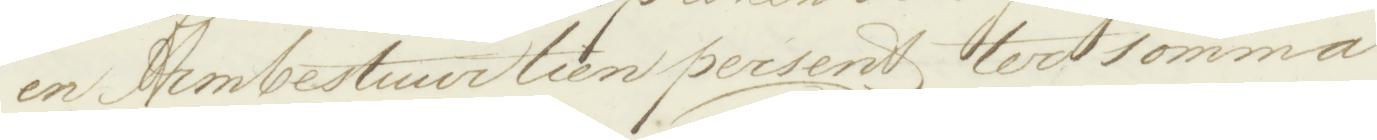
en Armbestuur tien persent ter somma
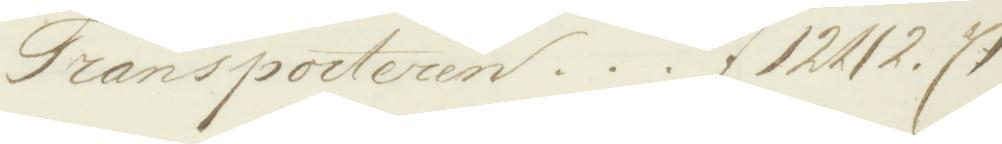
Transporteren . . . ƒ 1242.71
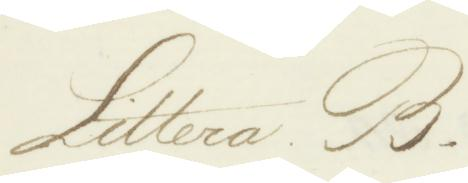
Littera. B.
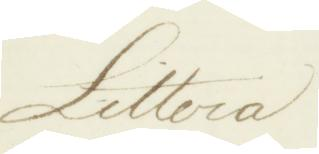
Littera C
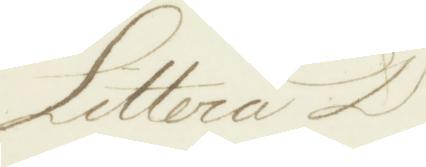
Littera D
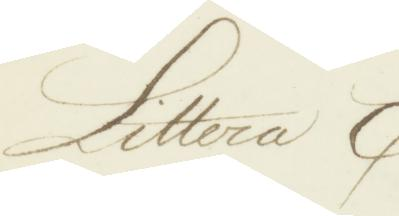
Littera E
